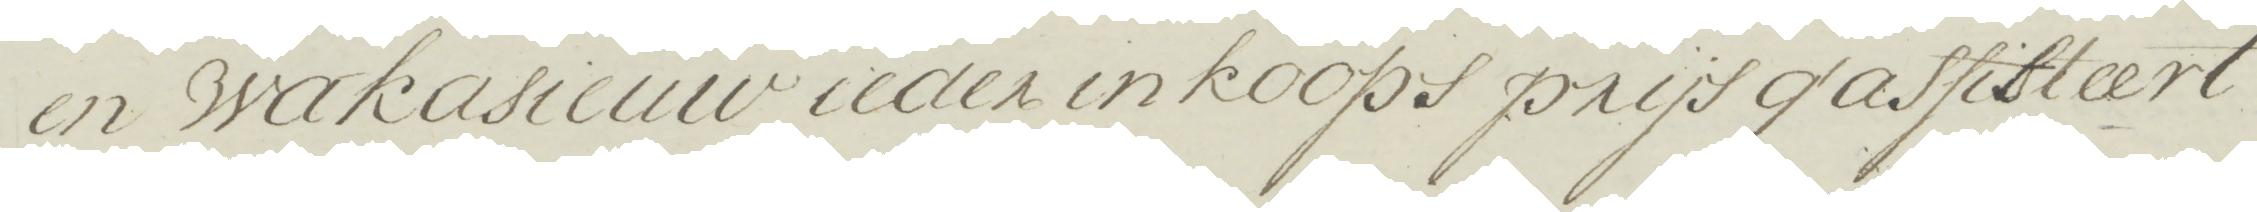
en wakasieuw ieder in koops prijs g’assisteert
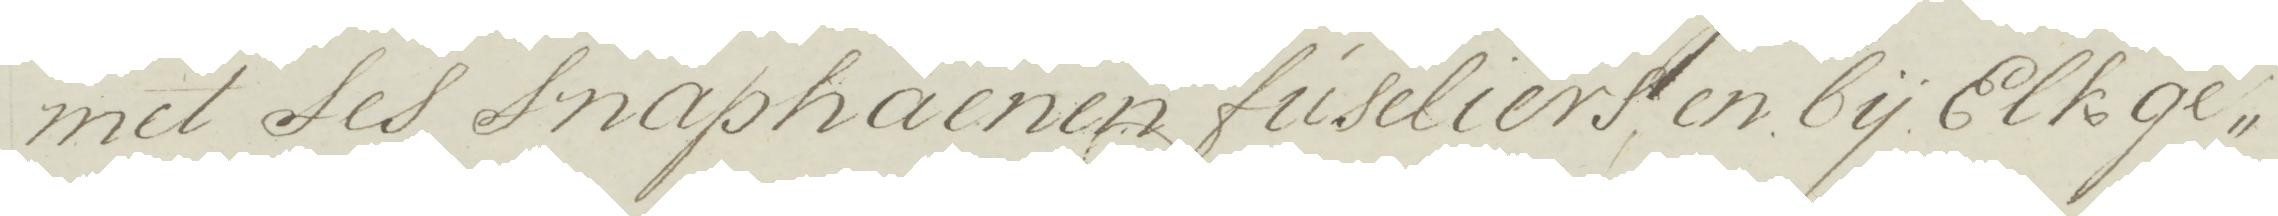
met ses snaphaenen fuseliers, en bij Elk ge„
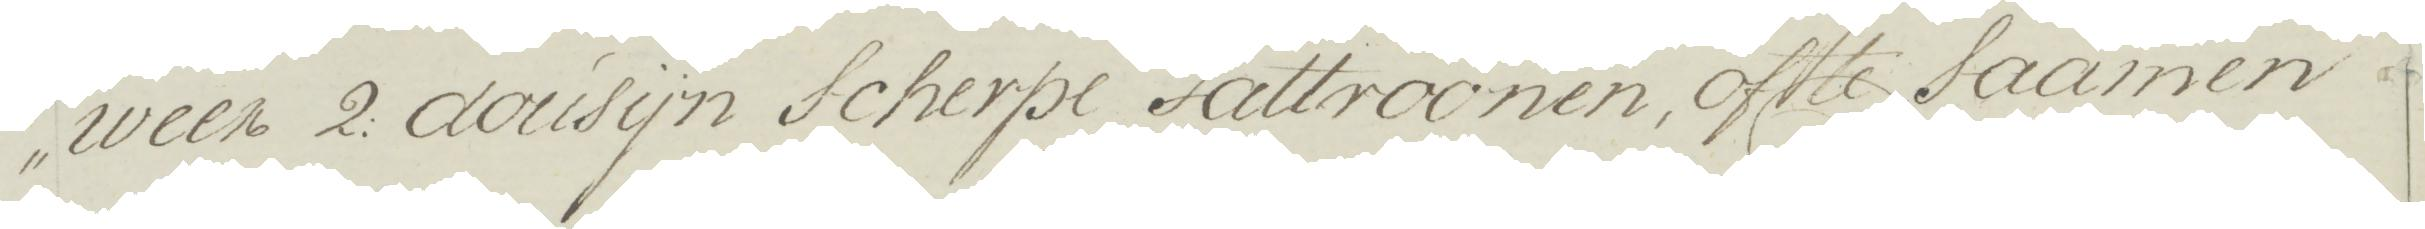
„weer 2: dousijn scherpe Pattroonen, of te saamen
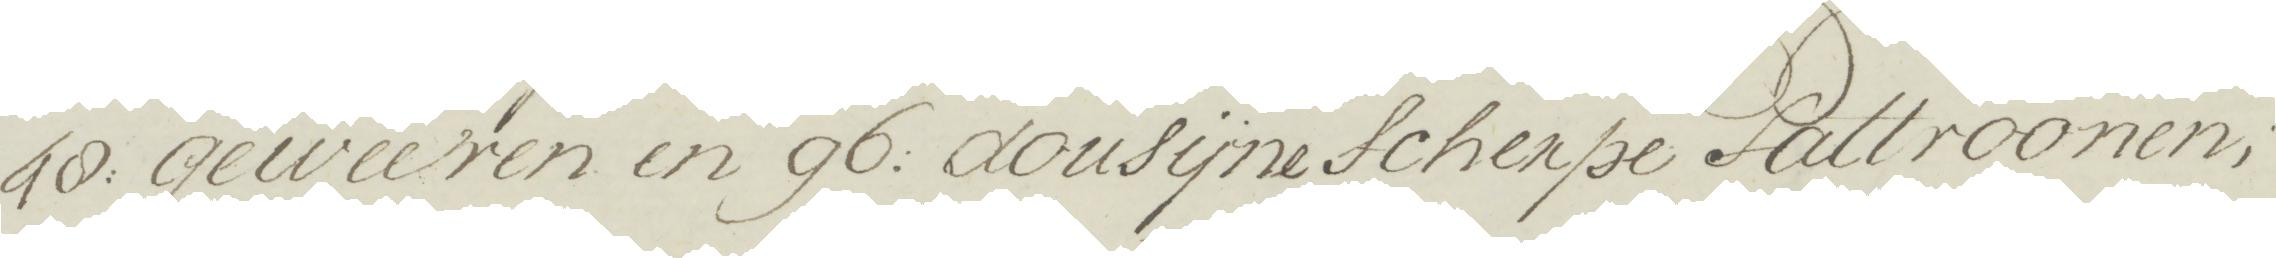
48: geweeren en 96: dousijne scherpe Pattroonen;
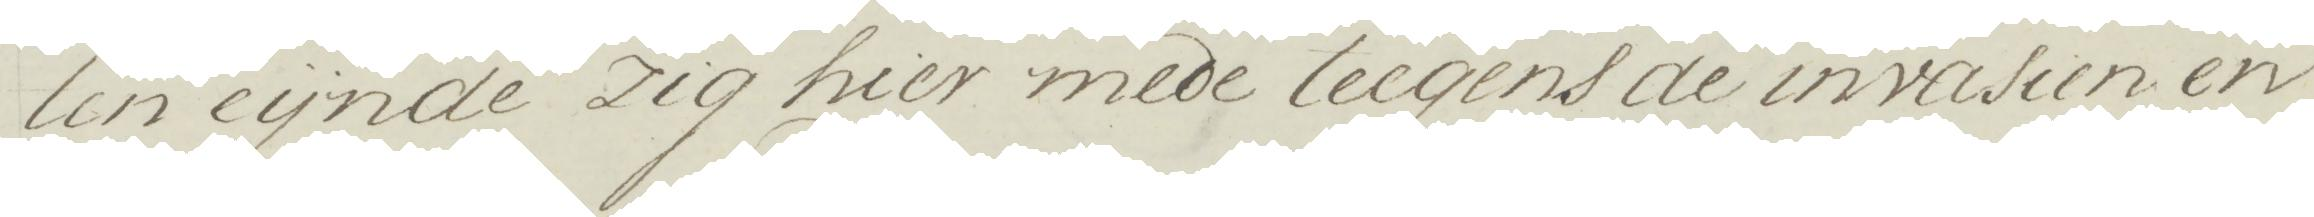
ten eijnde zig hier mede teegens de invasien en
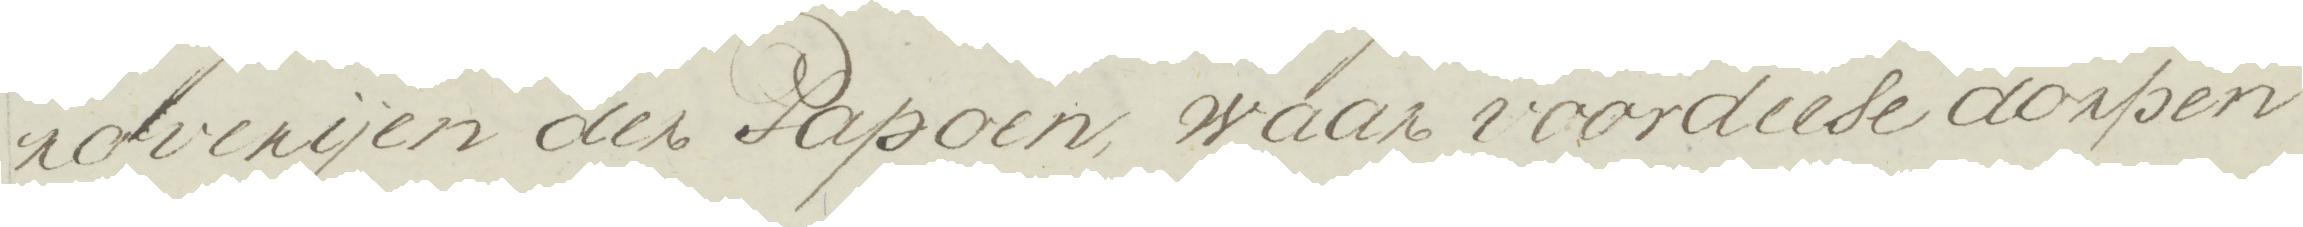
roverijen der Papoen, waar voor deese dorpen
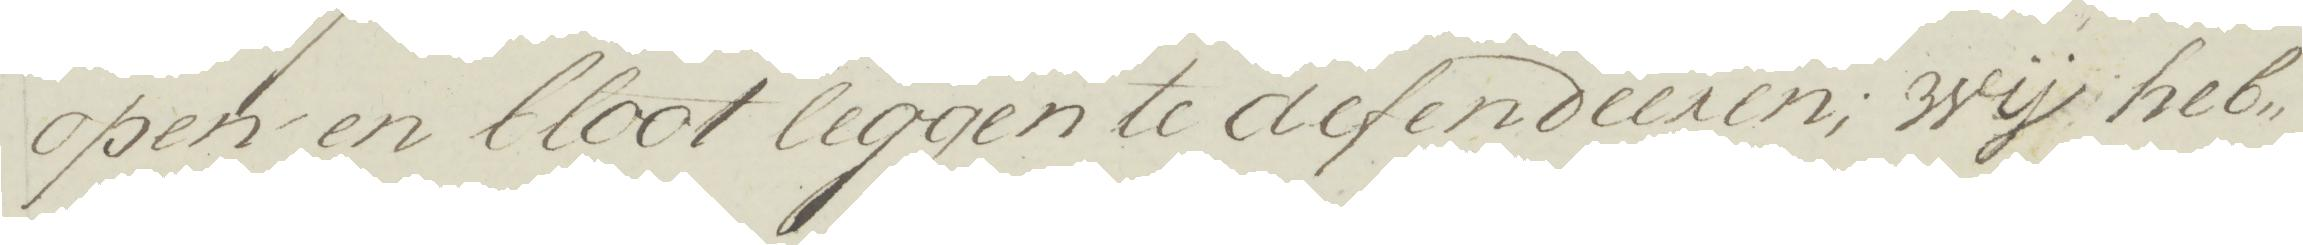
open en bloot leggen te defendeeren; wij heb„
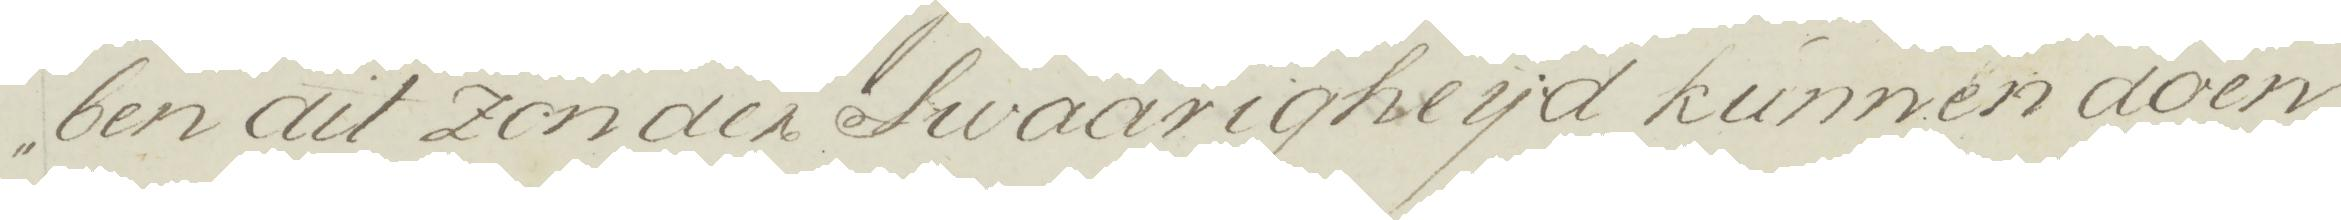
„ben dit zonder swaarigheijd kunnen doen,
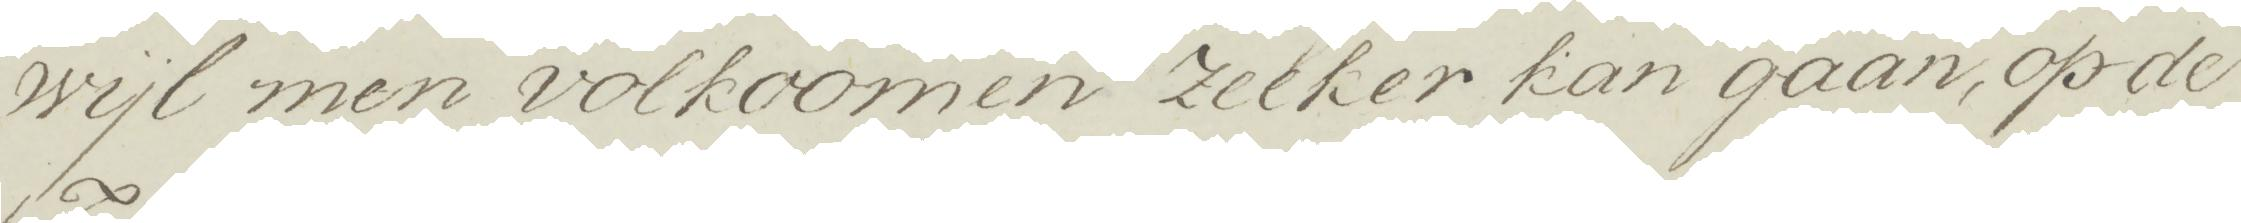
wijl men volkoomen zeeker kan gaan, op de
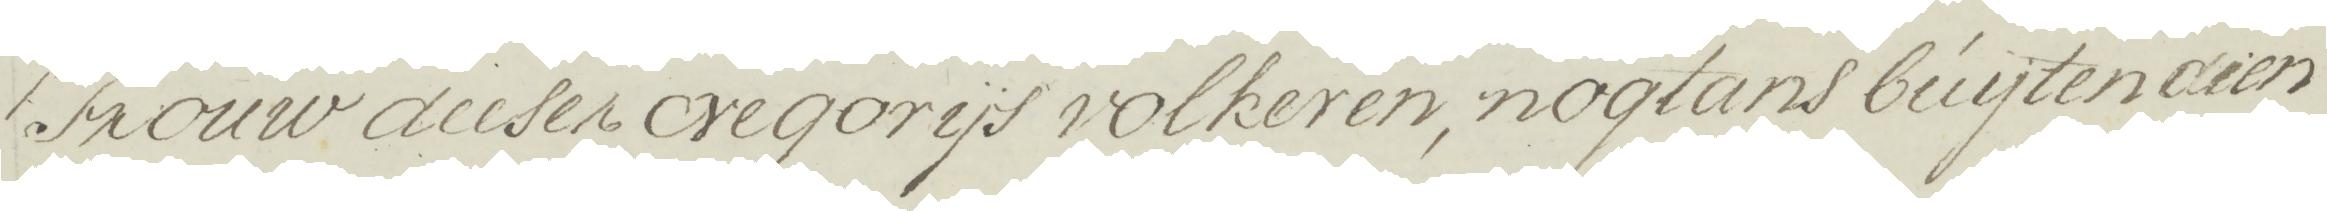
Trouw deeser negorijs volkeren, nogtans buijten dien
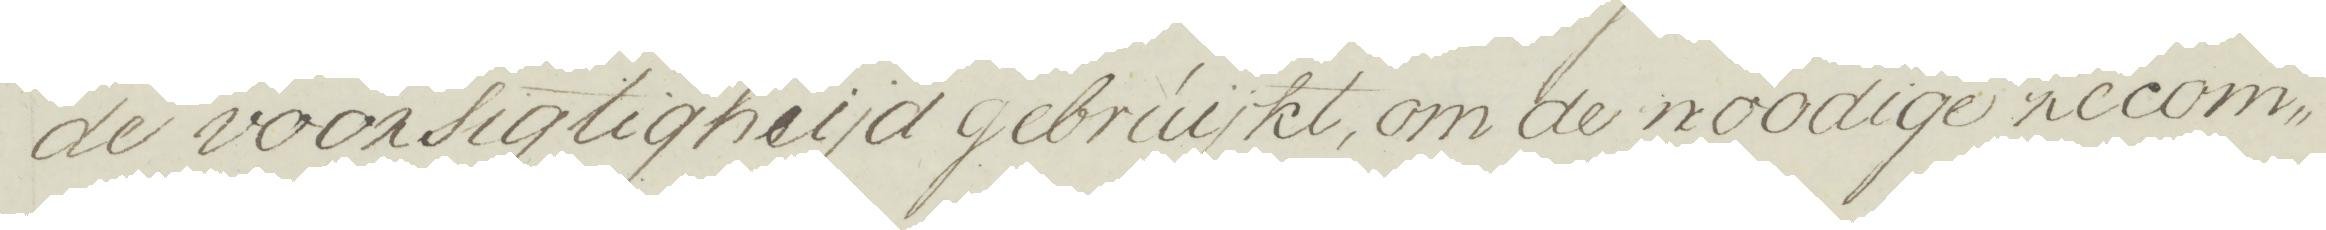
de voorsigtigheijd gebruijkt, om de noodige recom„
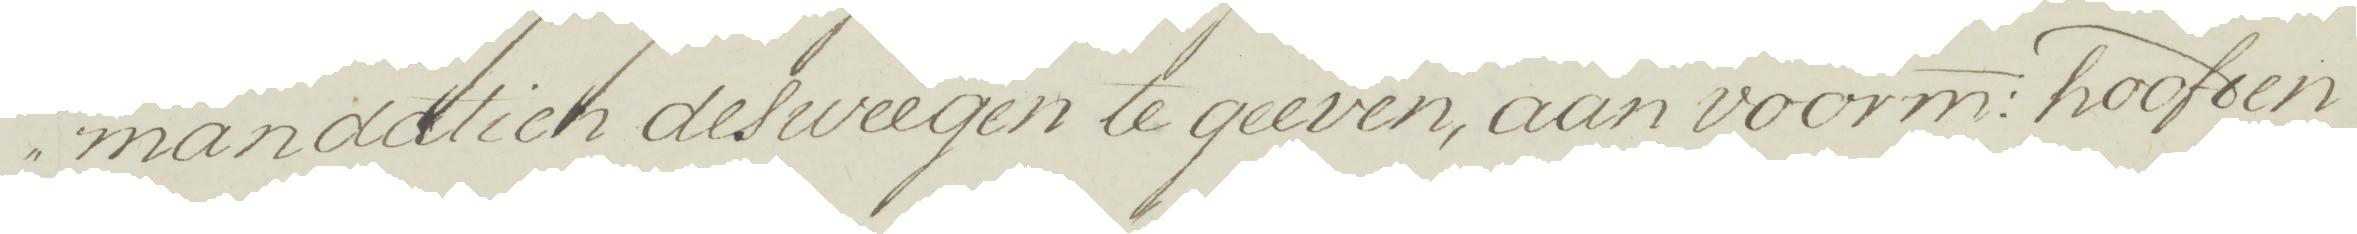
„mandatien desweegen te geeven, aan voorm: hoofden
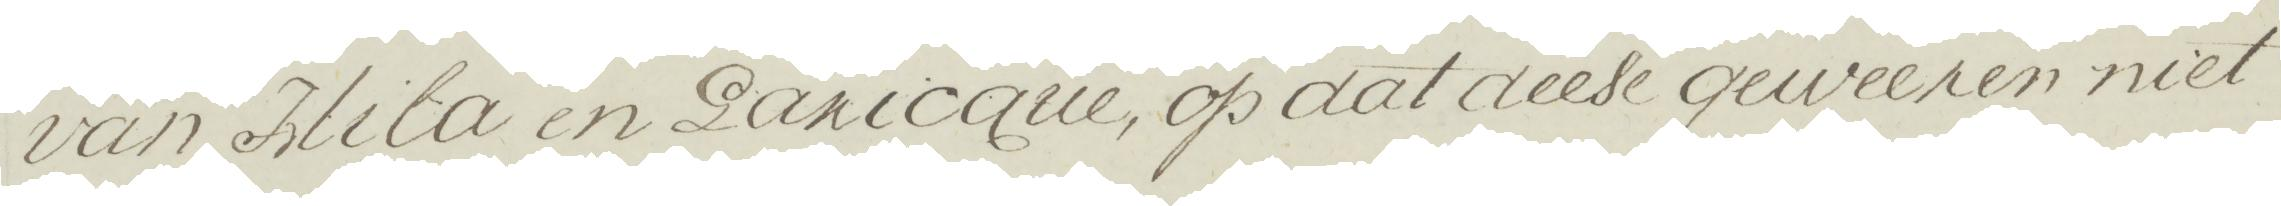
van Hila en Laricque, op dat deese geweeren niet
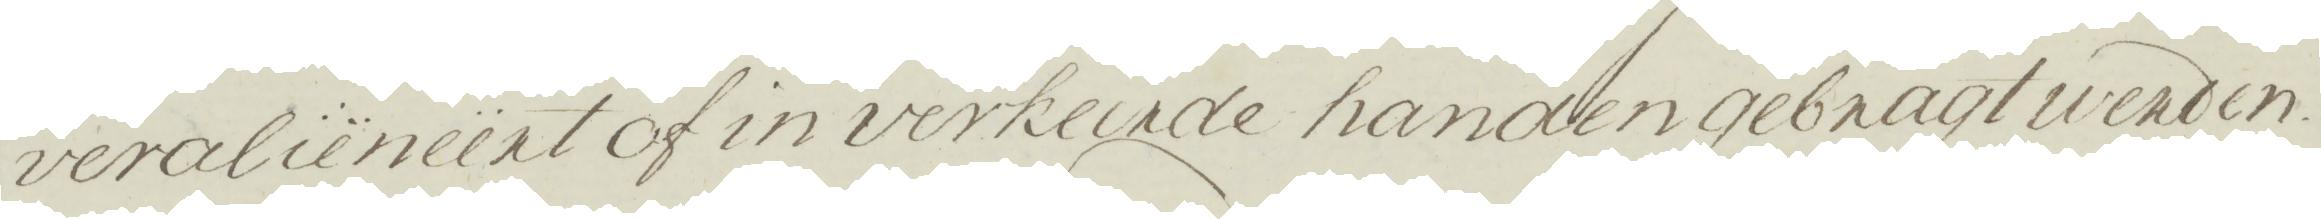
veraliëneërt of in verkeerde handen gebragt werden
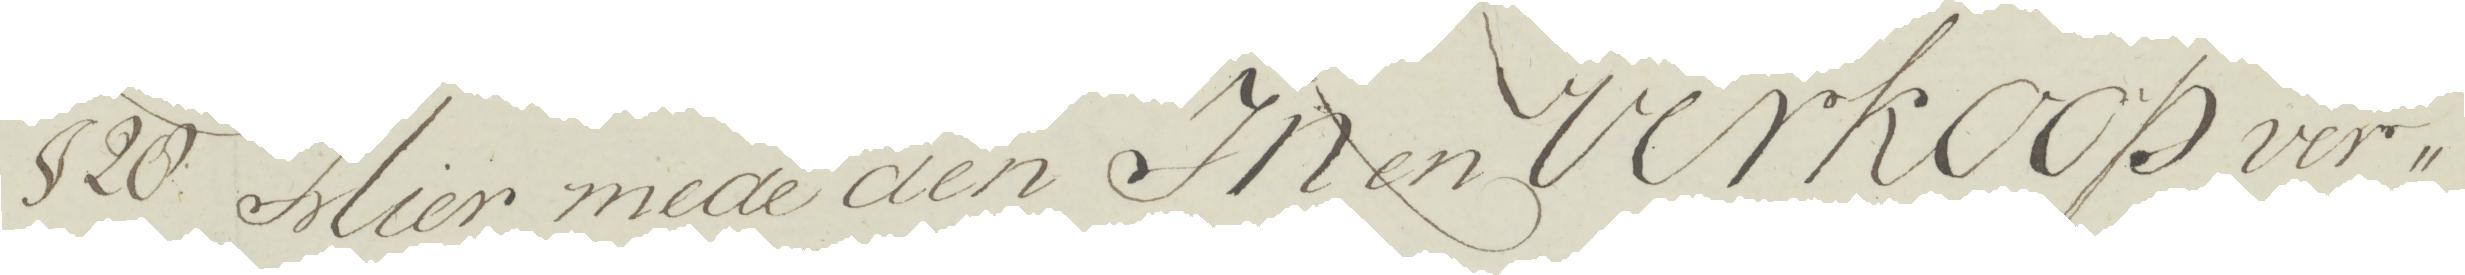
§ 28: Hier mede den In en Verkoop ver„
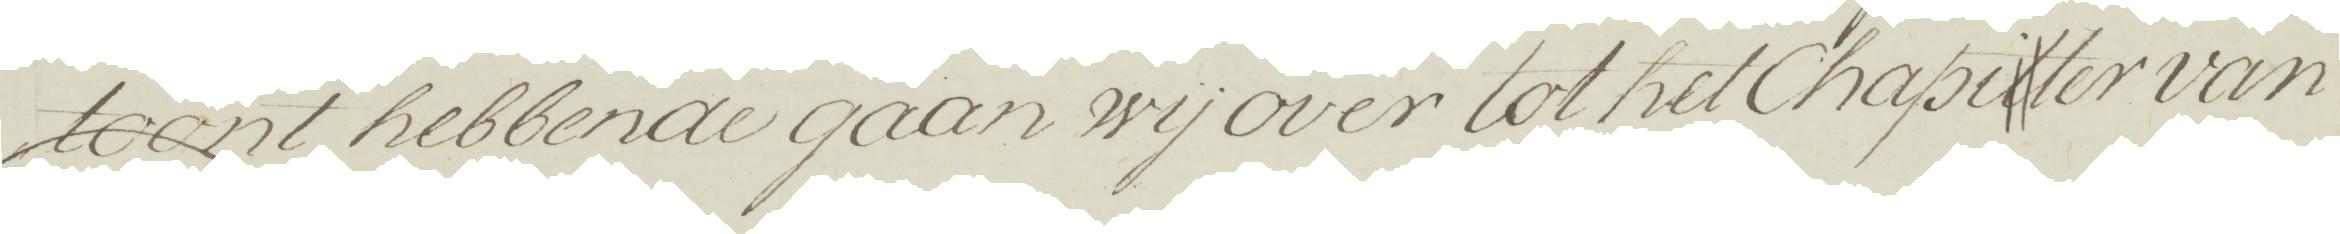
toont hebbende gaan wij over tot het Chapitter van
